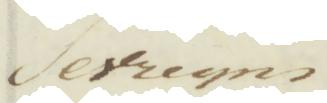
Sevreyns
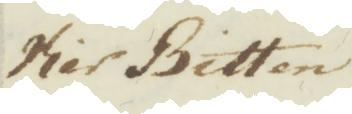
Vier Bitten
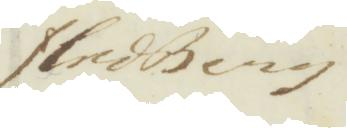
JCvdBerg
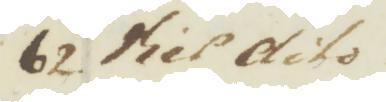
62 Vier dito
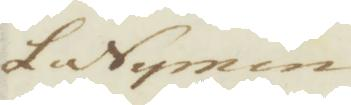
La Nymen
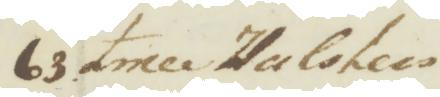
63 twee Halsters
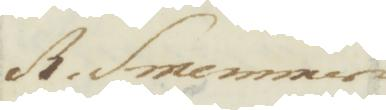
R. Smemmer
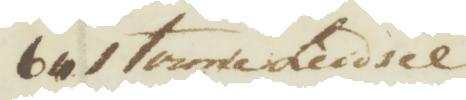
641 tourde Leidsel
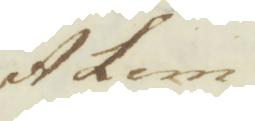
A Lem
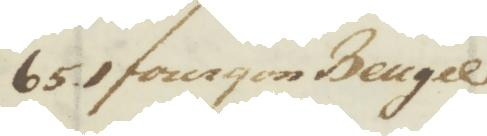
651 fourgon Beugel
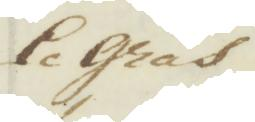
Le Gras
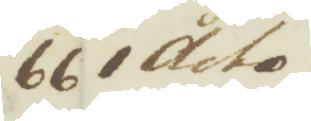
66 1 dito
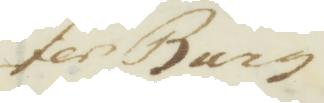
ter Burg
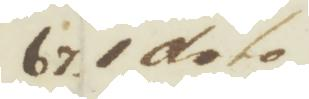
67 1 dito
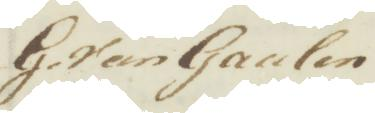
G. van Gaalen
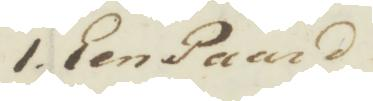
1. Een Paard
